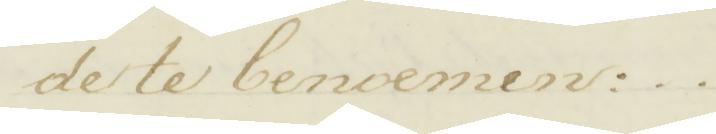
de te benoemen: . .
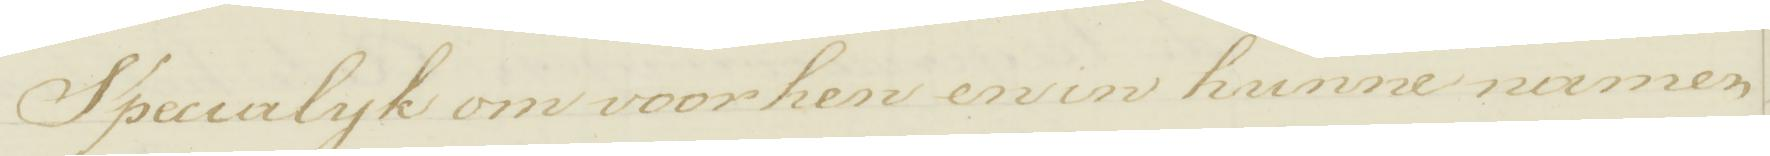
Specialyk om voor hen en in hunne namen
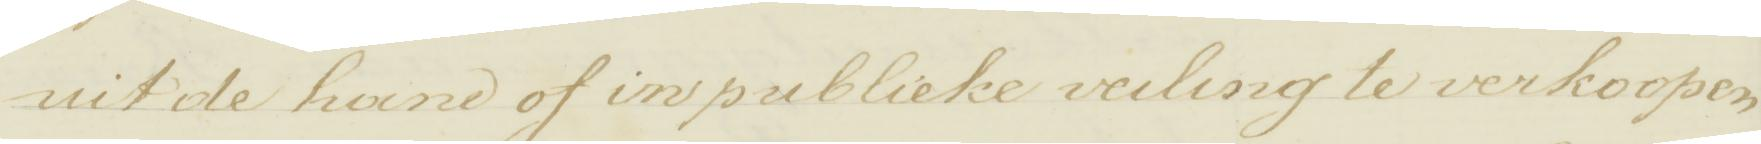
uit de hand of in publieke veiling te verkoopen
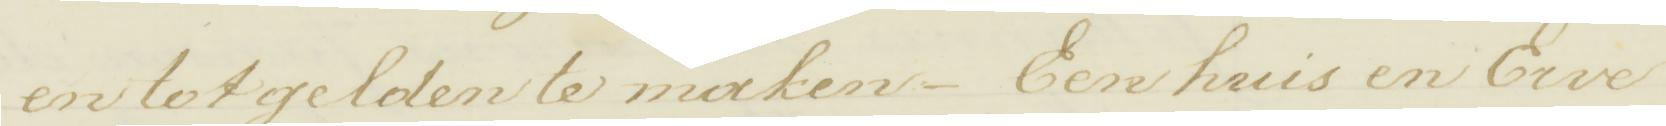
en tot gelden te maken - Een huis en Erve
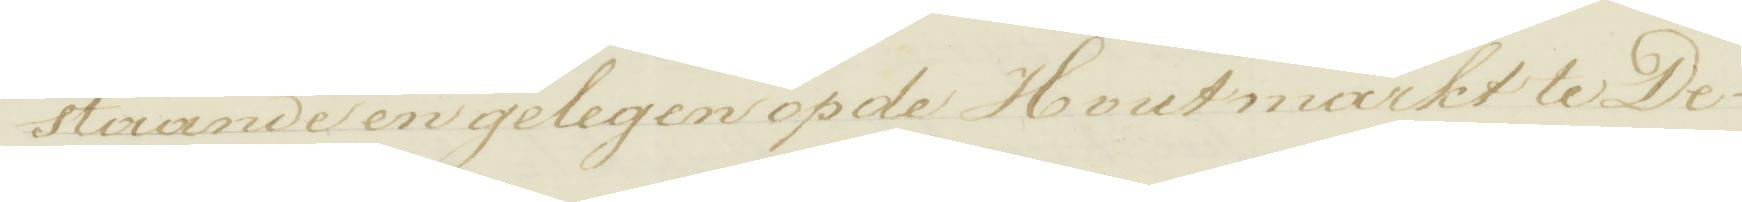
staande en gelegen op de Houtmarkt te De
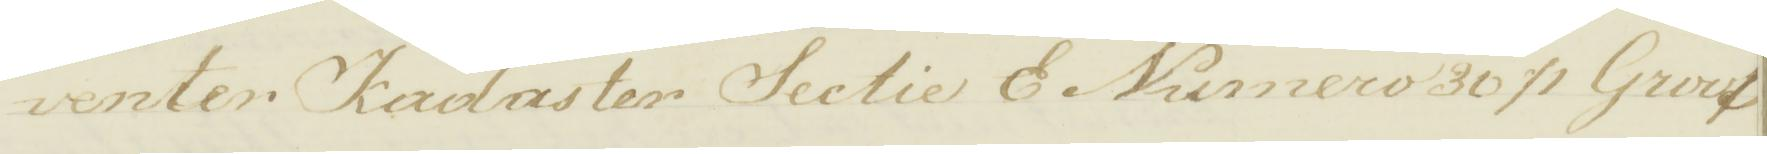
venter Kadaster Sectie E Numero 3071 Groot
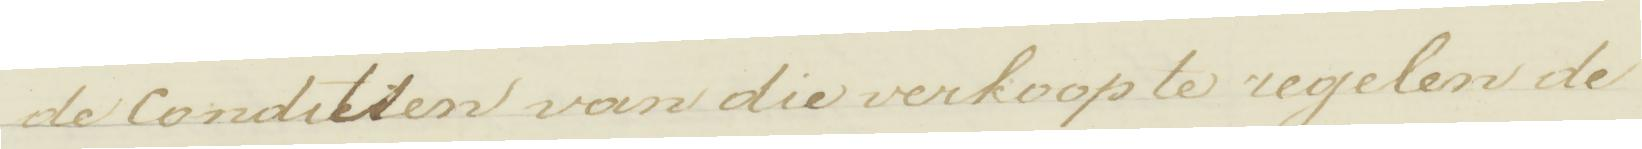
de conditien van die verkoop te regelen de
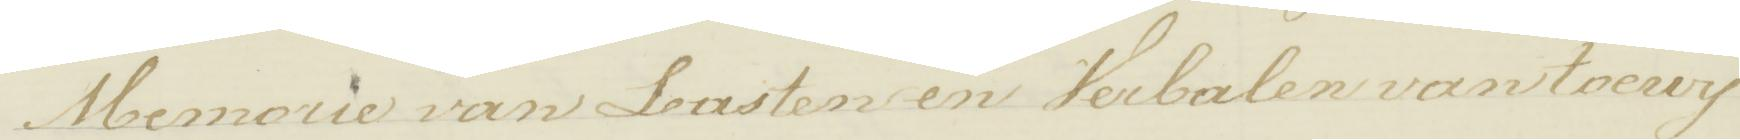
Memorie van Lasten en Verbalen van toewy
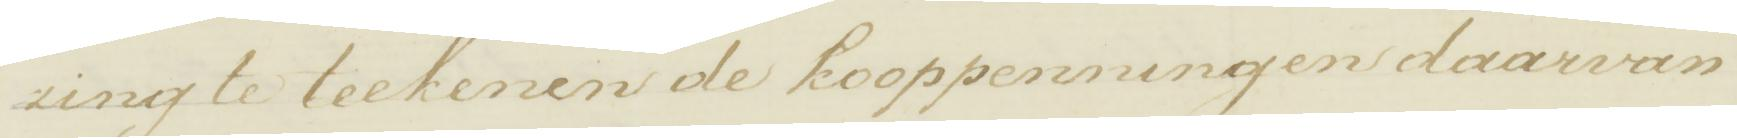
zing te teekenen de kooppenningen daarvan
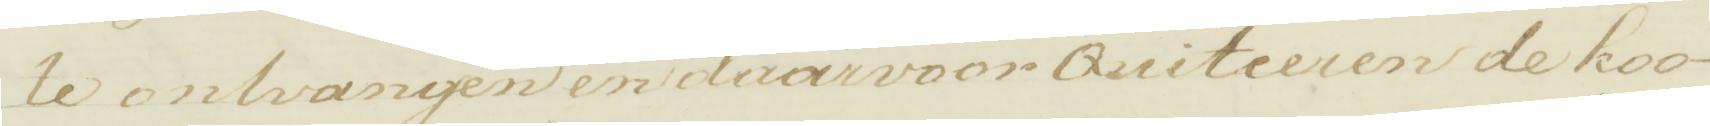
te ontvangen en daarvoor Quiteeren de koo-
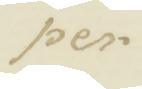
per
